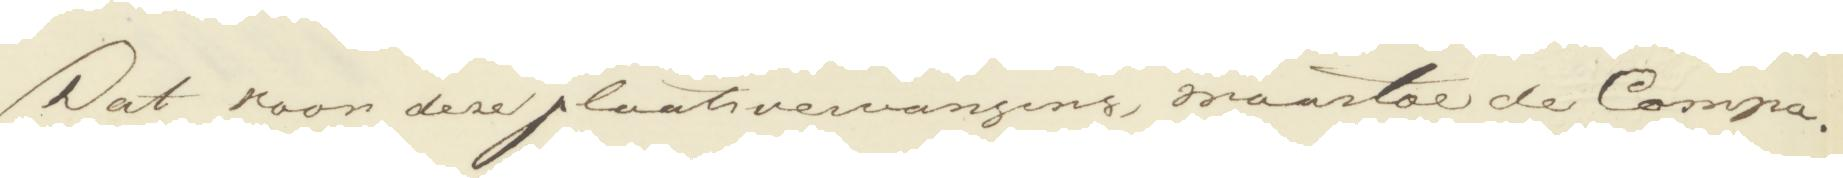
Dat voor deze plaatsvervanging, waartoe de Compa.
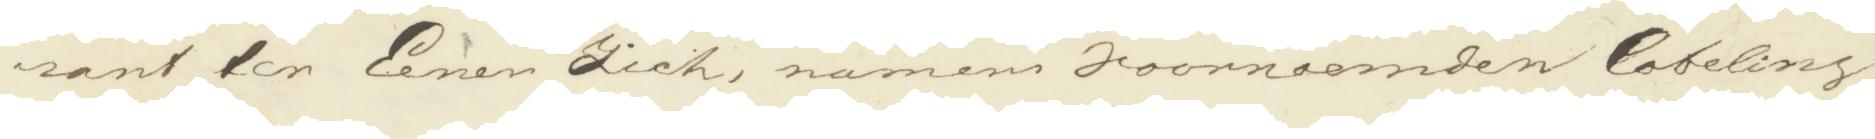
rant ten Eenen zich, namens voornoemden loteling
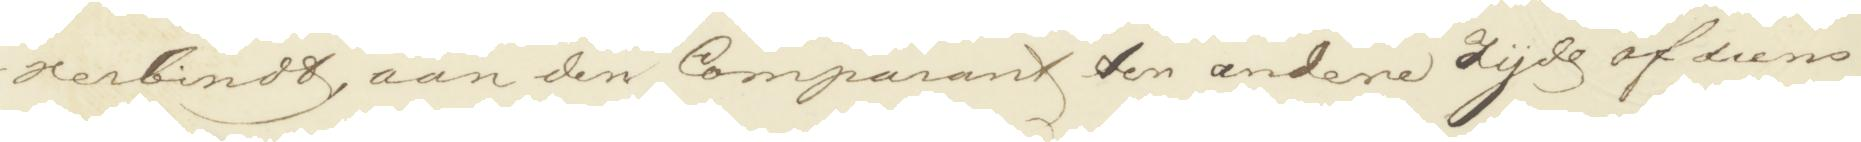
verbindt, aan den Comparant ten andere zijde of diens
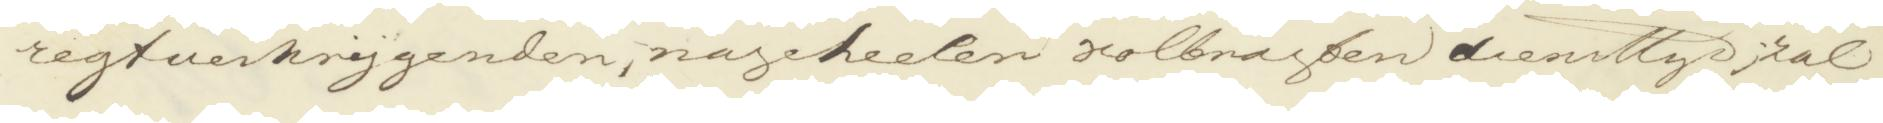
regt verkrijgenden, nageheelen volbragten diensttijd, zal
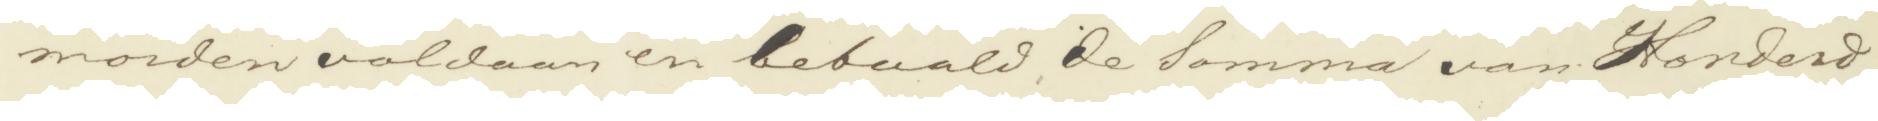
worden voldaan en betaald de somma van Honderd
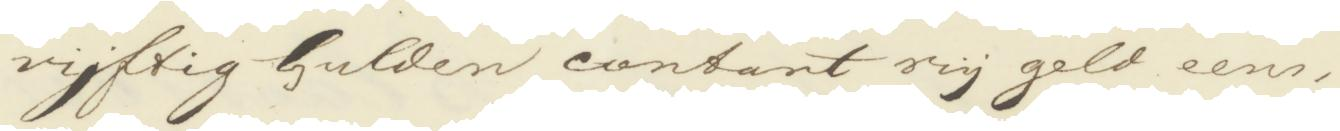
vijftig Gulden contant vrij geld eens,
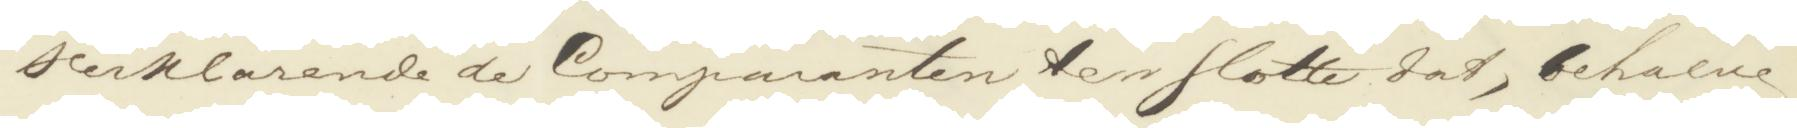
verklarende de Comparanten ten slotte dat, behalve
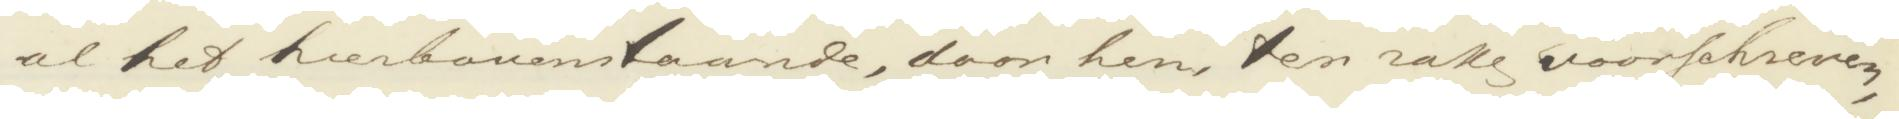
al het hierbovenstaande, door hen, ten zaken voorschreven,
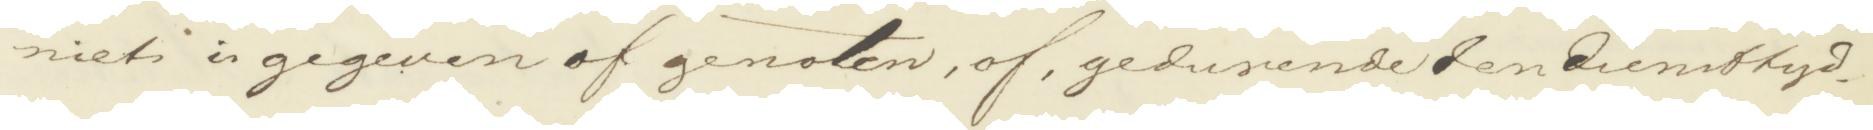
niets is gegeven of genoten, of, gedurende den diensttyd
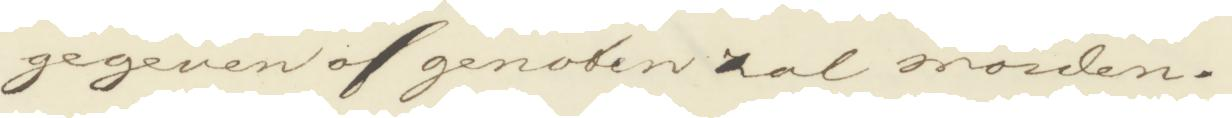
gegeven of genoten zal worden.
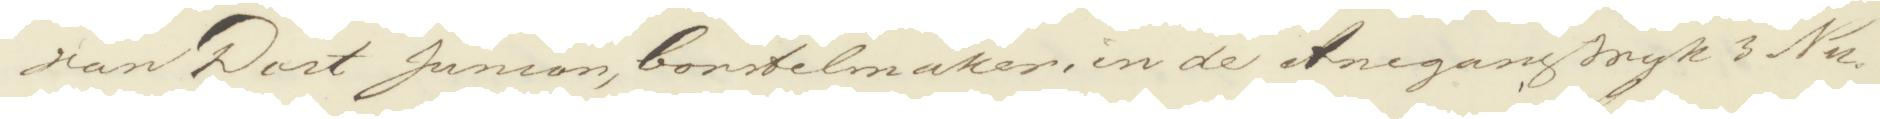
van Dort Junior, borstelmaker, in de Anegang wyk 3 Nu,
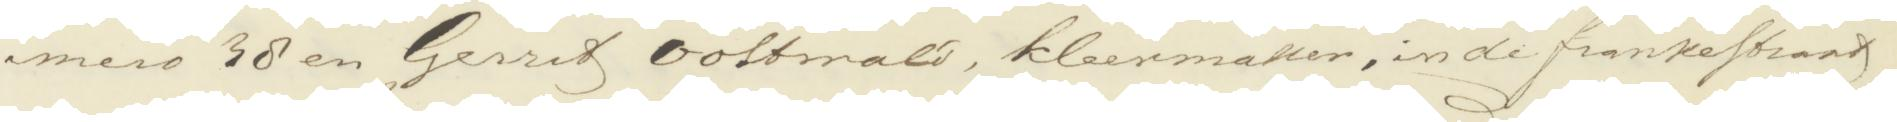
mero 38 en Gerrit Oostwald, kleermaker, in de frankestraat
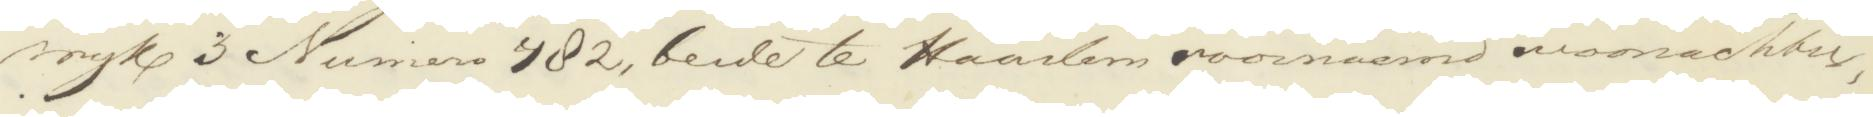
wyk 3 Numero 782, beide te Haarlem voornoemd woonachtig,
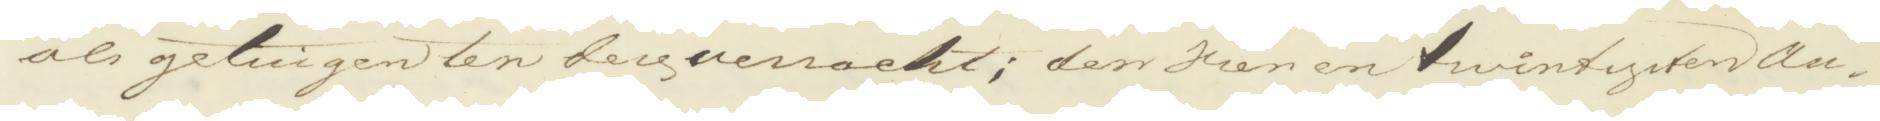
als getuigen ten deze verzocht; den Vier en twintigsten au,
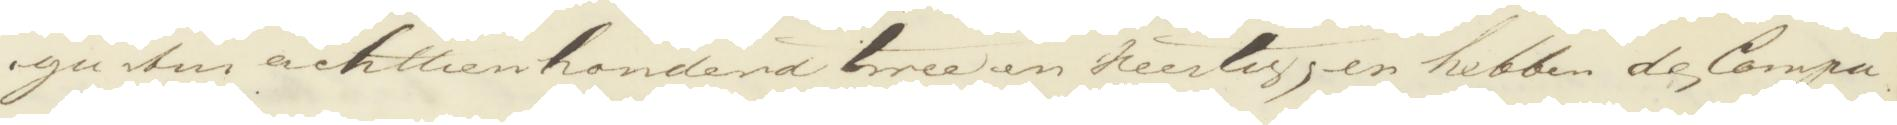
,gustus achttien honderd twee en Veertig en hebben de Compa
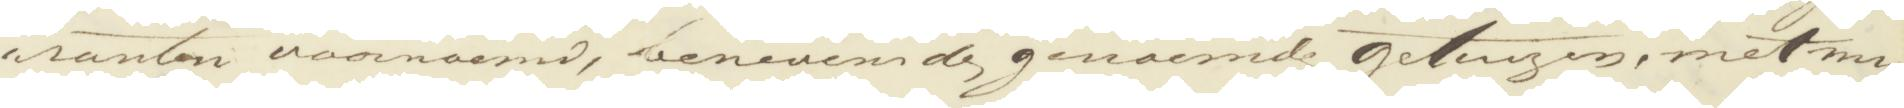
ranten voornoemd, benevens de genoemde getuigen, met my
